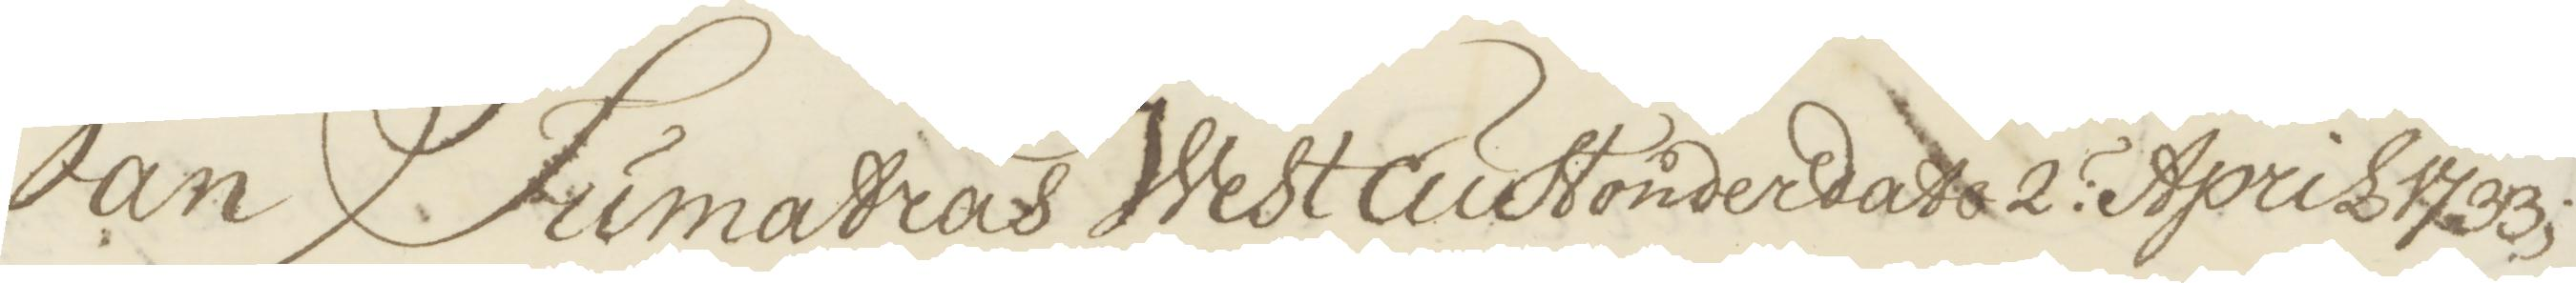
Van Sumatras west cust onder dato 2:' April 1733;
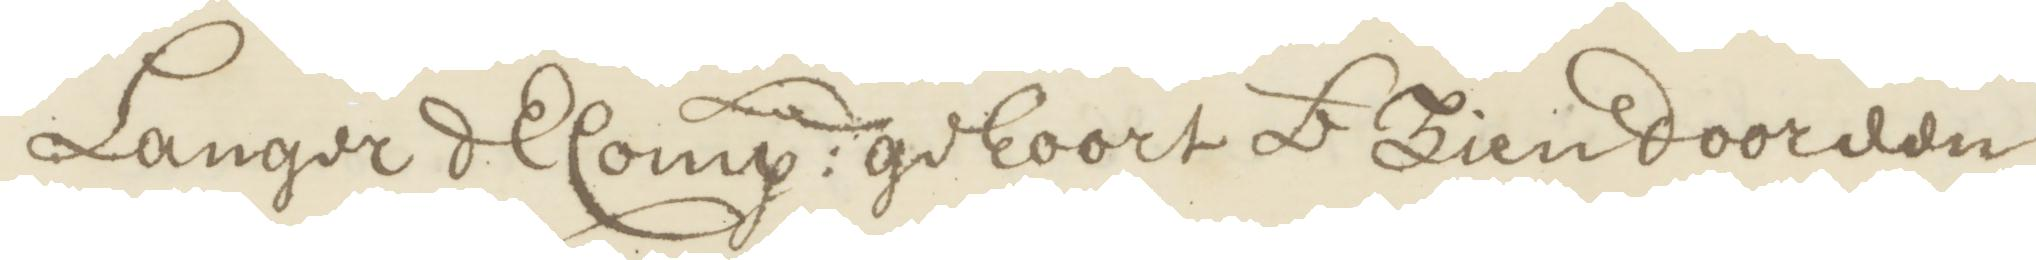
Langer d E Comp:s gehoort te zien door een
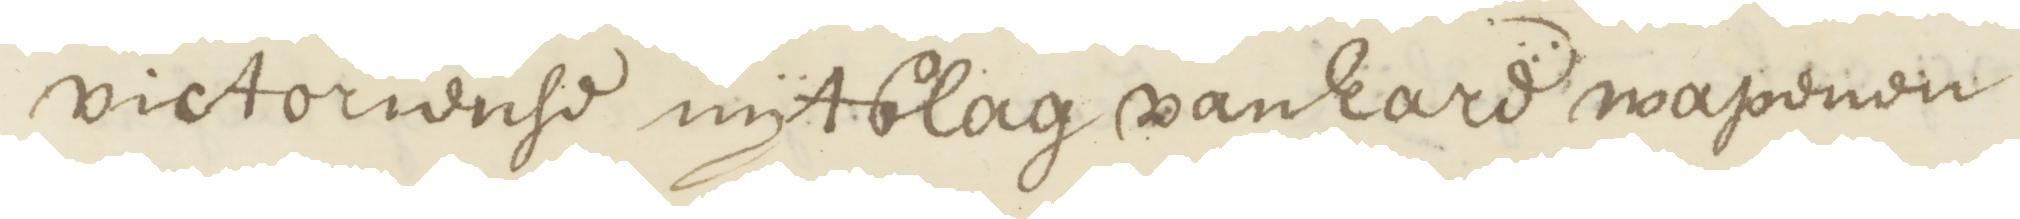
victoriense uijtslag van hare wapenen
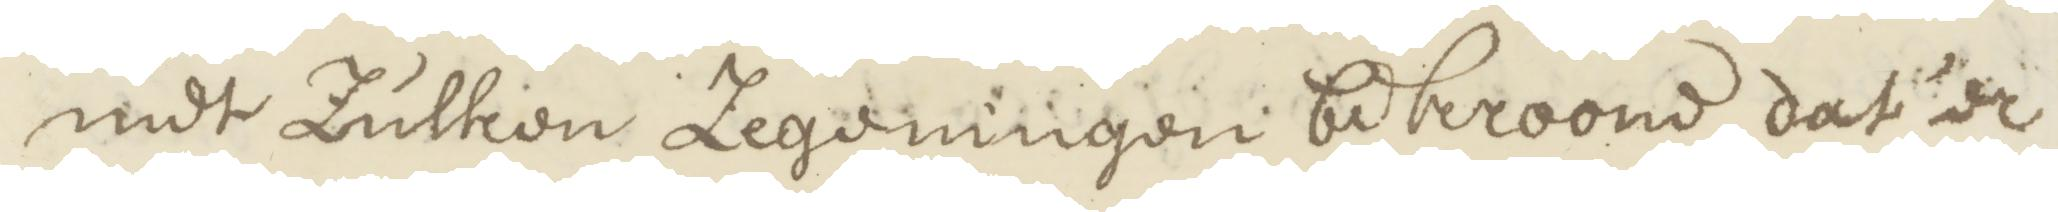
met zulken zegeningen bekroone dat 'er
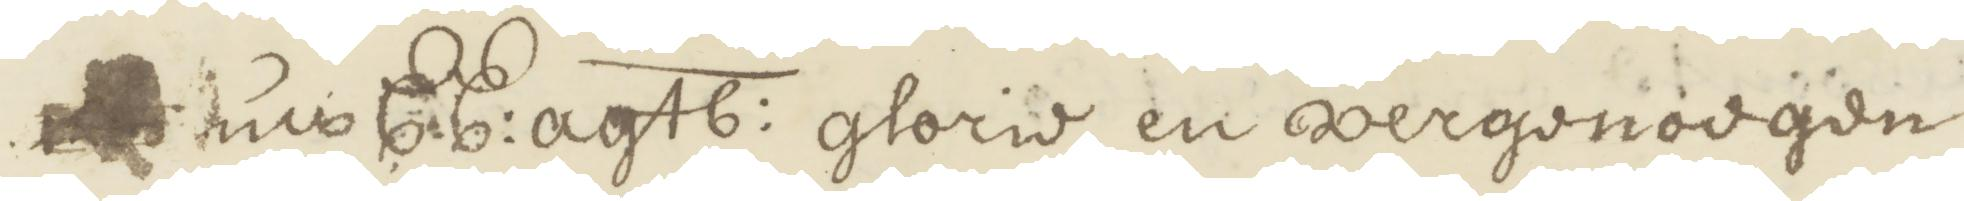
Ed: uw E: E: agtb: glorie en vergenoegen
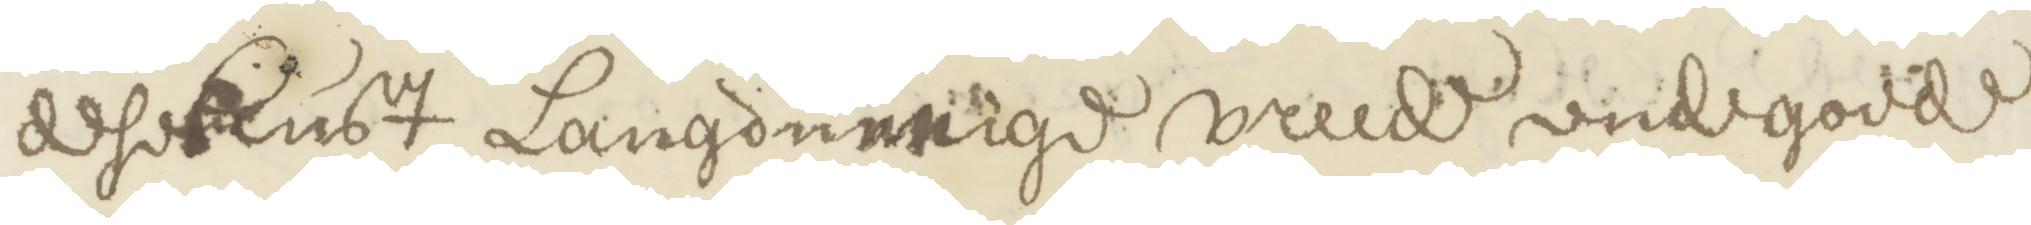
deses cust Langduurige vreede ende goede
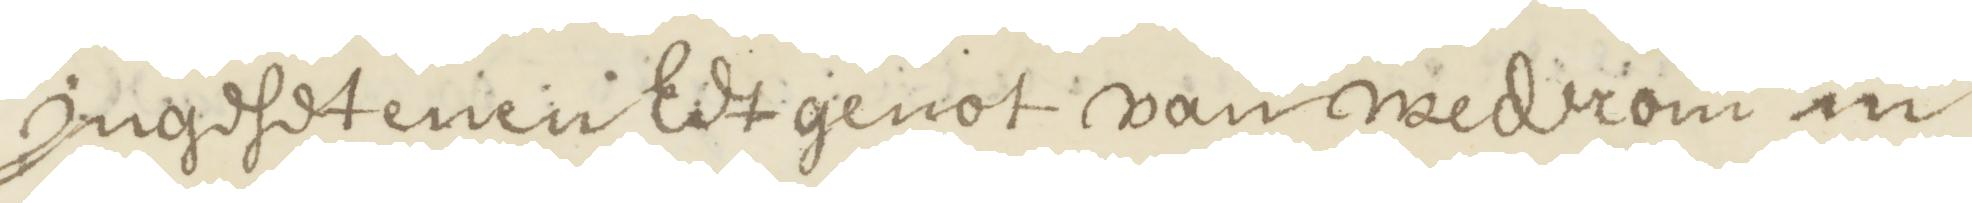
jngesetenen het genot van wederom in
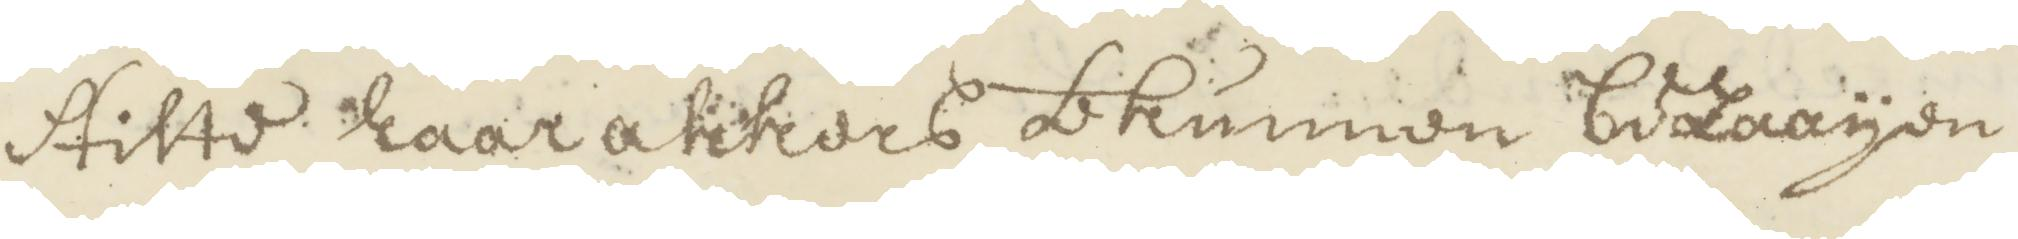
stilte haar akkers te kunnen bezaaijen
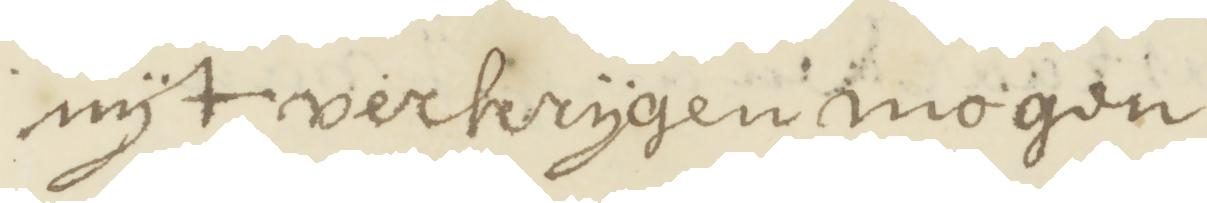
uijt verkrijgen mogen; —
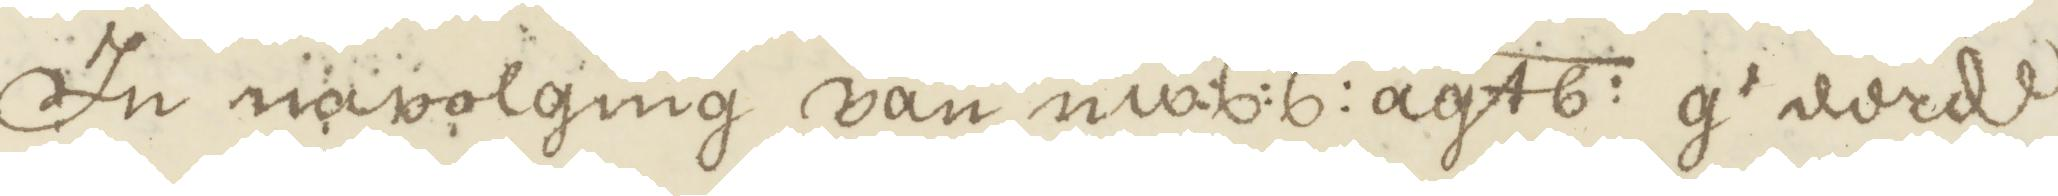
In navolging van uw: E: E: agtb: g’eerde
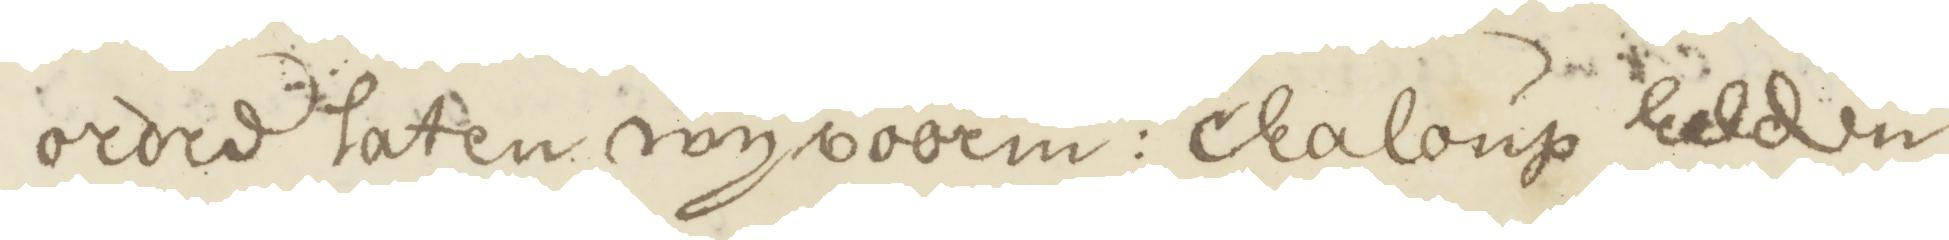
ordre laten wij voorm: chaloup heden
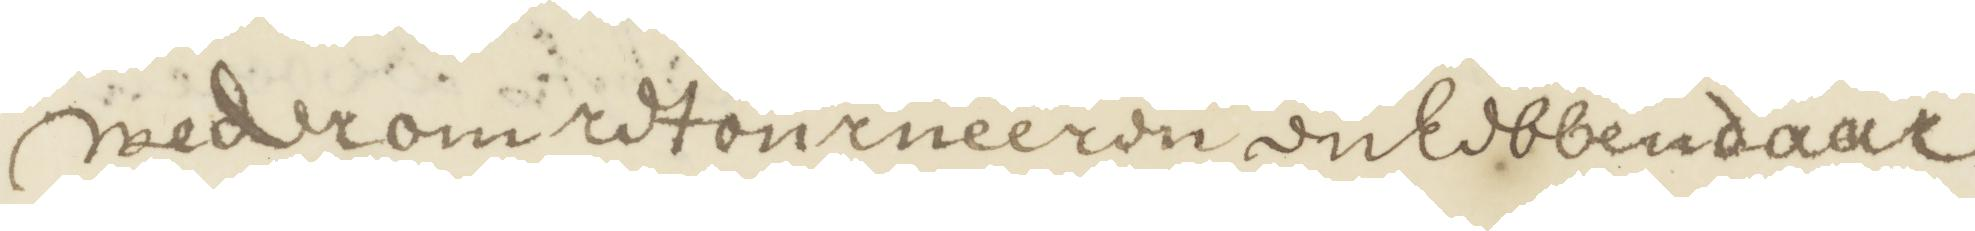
wederom retourneeren en hebben daar
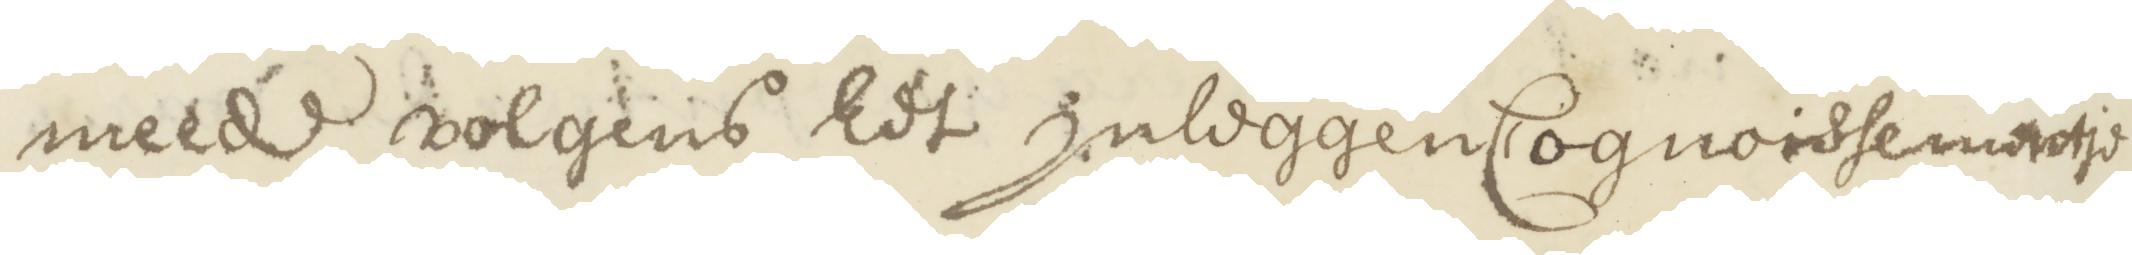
meede volgens het jnleggen Cognoissementje
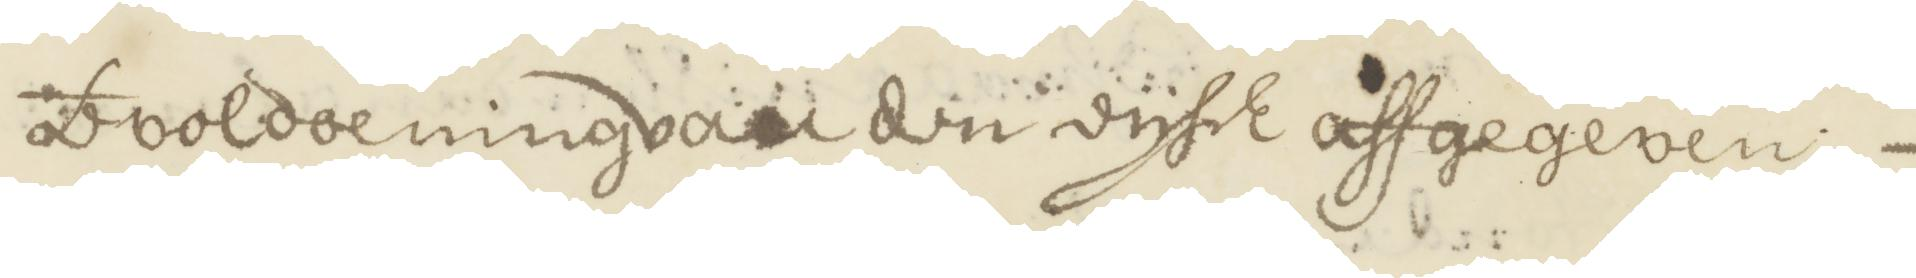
te voldoening van den eijsch affgegeven; —
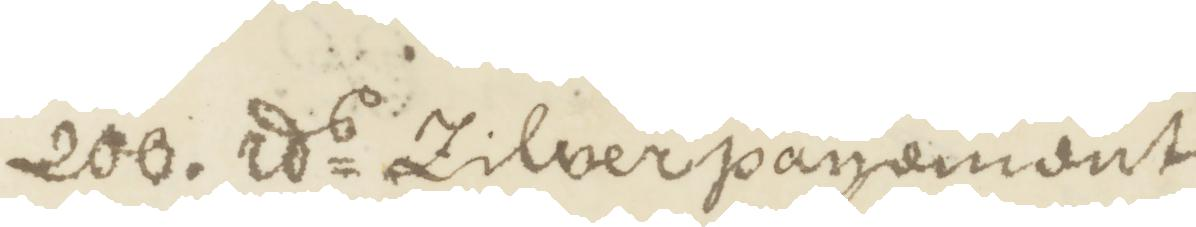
200. rd=s zilver paijement
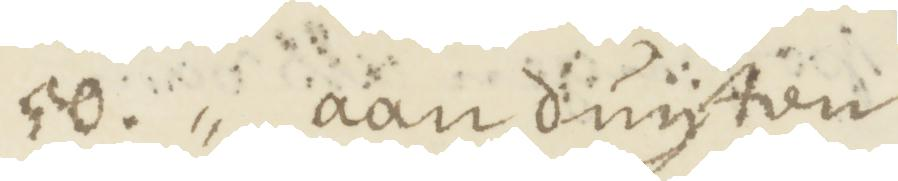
50. „ aan duijten
